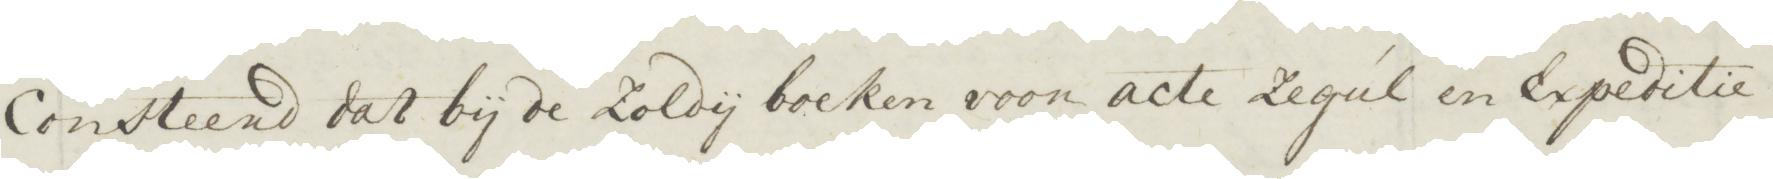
Consteerd dat bij de Zoldij boeken voor acte Zegul en Expeditie
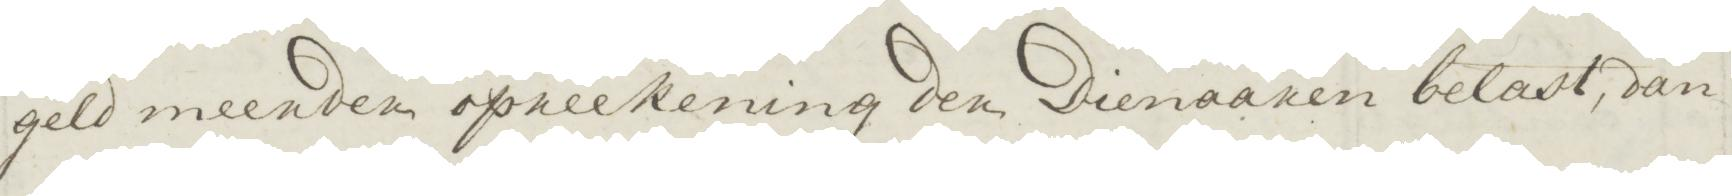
geld meerder opreekening der Dienaaren belast, dan
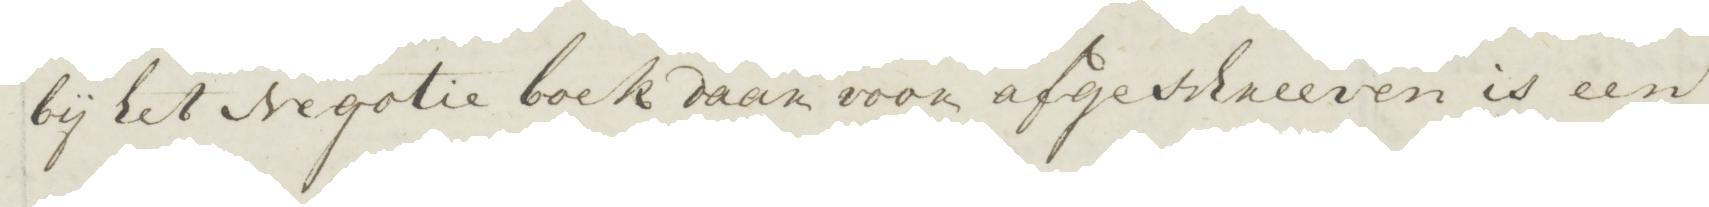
bij het Negotie boek daar voor afgeschreeven is een
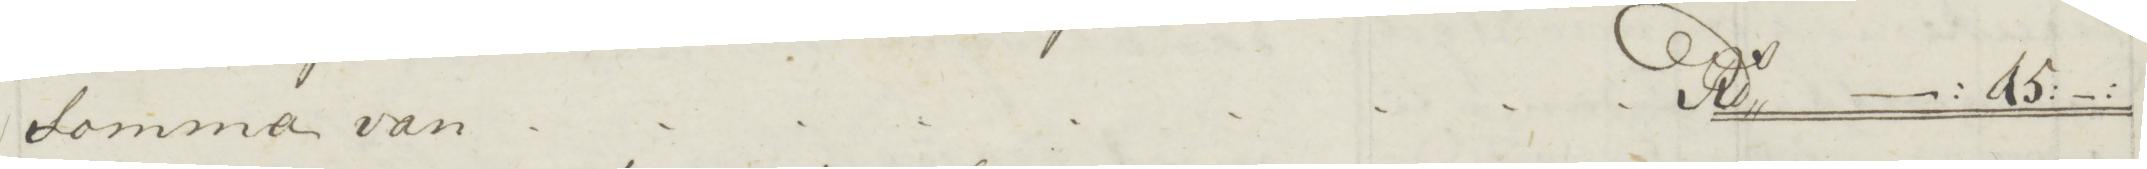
Somma van . . . . . . . . . Rd„s —: 45: —:
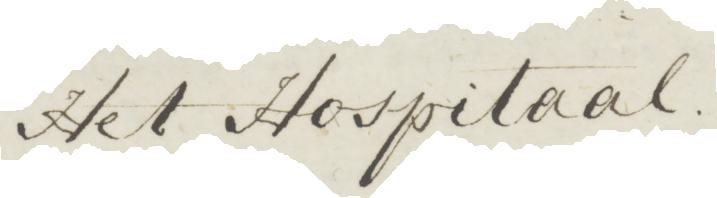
Het Hospitaal.
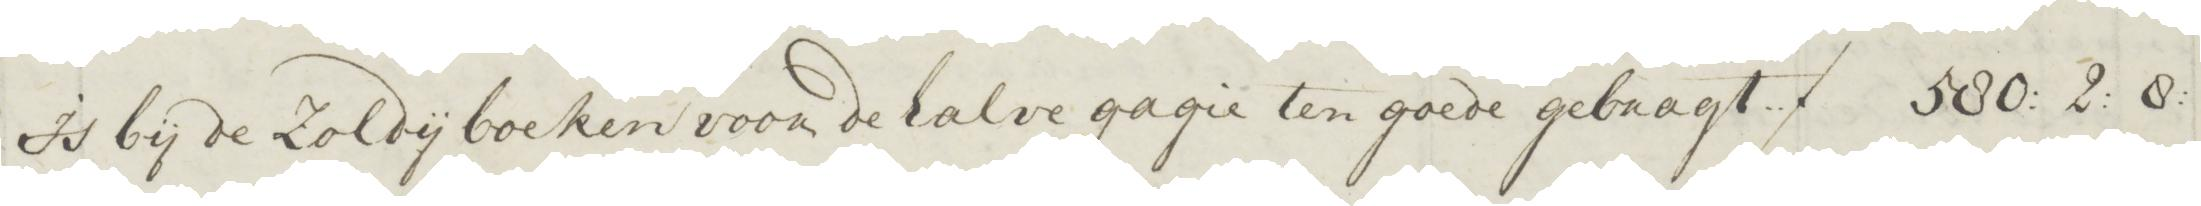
Is bij de Zoldij boeken voor de halve gagie ten goede gebragt ..ƒ 580: 2: 8:
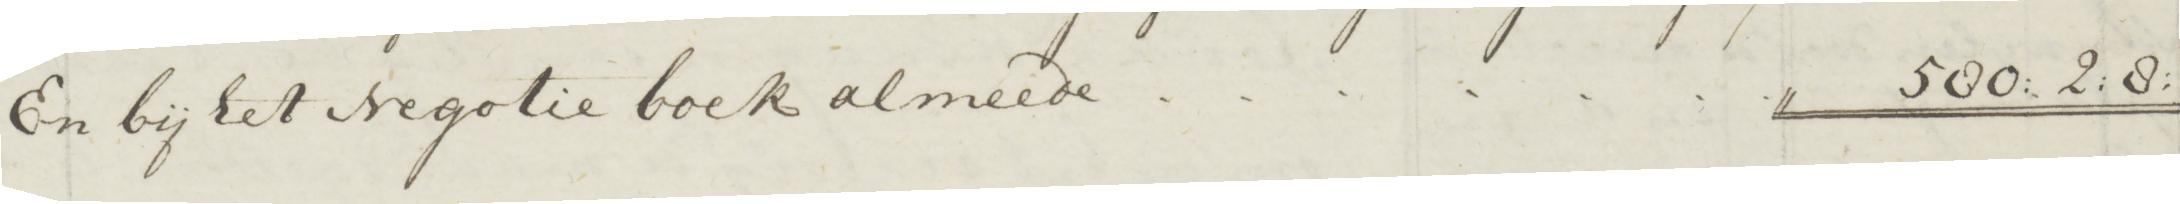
En bij het Negotie boek almeede . . . . . . . . „ 580: 2: 8:
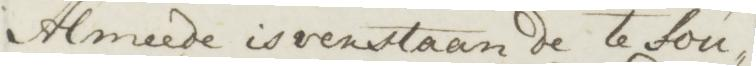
Almeede is verstaan de te Sou„
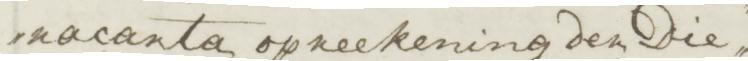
„racarta opreekening der Die„
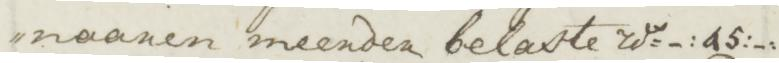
„naaren meerder belaste rd=s —: 45: —:
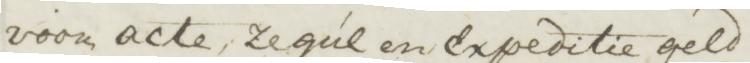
voor acte, zegul en Expeditie geld
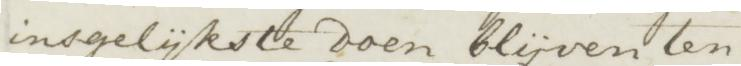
insgelijks te doen blijven ten
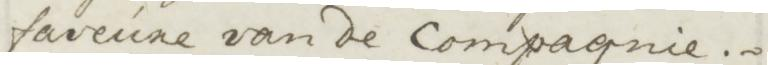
faveure van de Compagnie. ~
